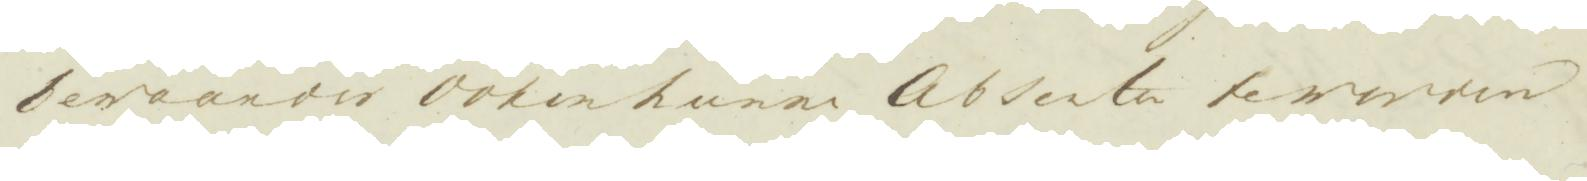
bewaarder ook in hunne Absentie te worden
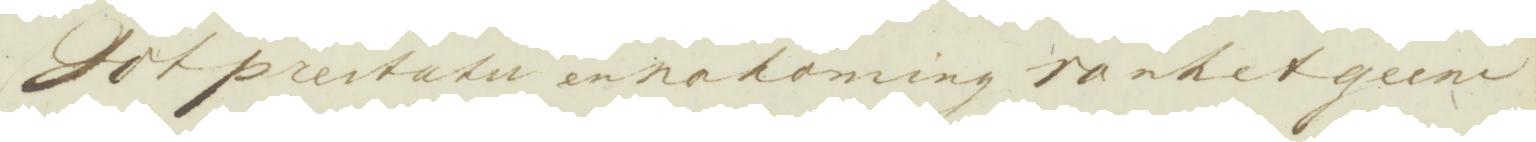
Tot prestatie en nakoming van het geene
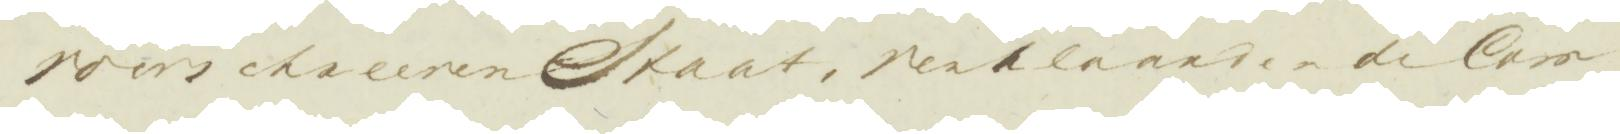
voors chreeven Staat, verklaarden de Com
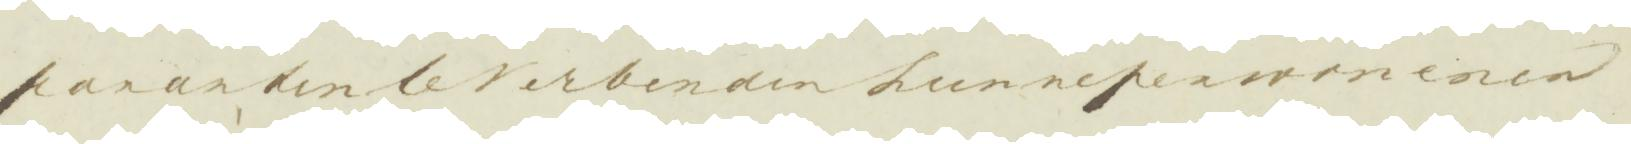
paranten te verbinden hunne persoonen en
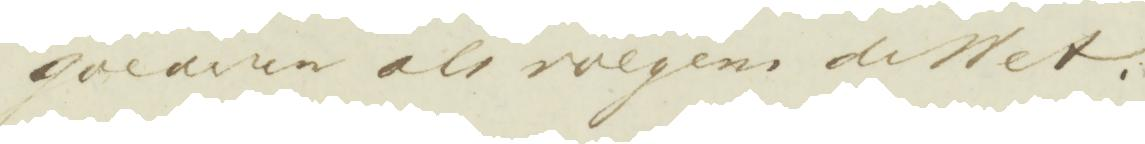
goederen als volgens de Wet.
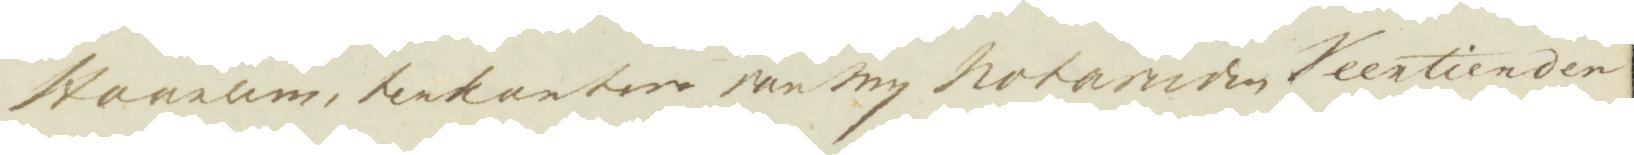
Haarlem, tern kantore van my Notaris den Veertienden
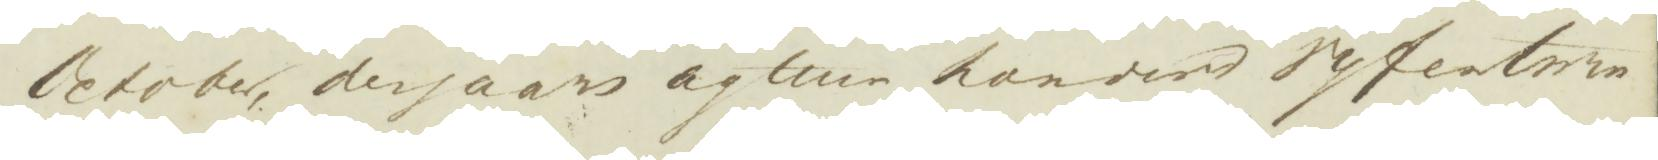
October, des jaars agttien honderd Vyfen twin
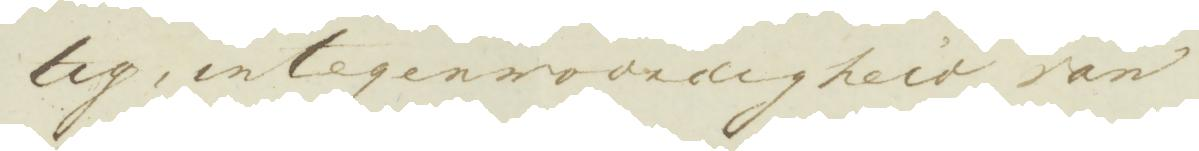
tig, in tegenwoordigheid van
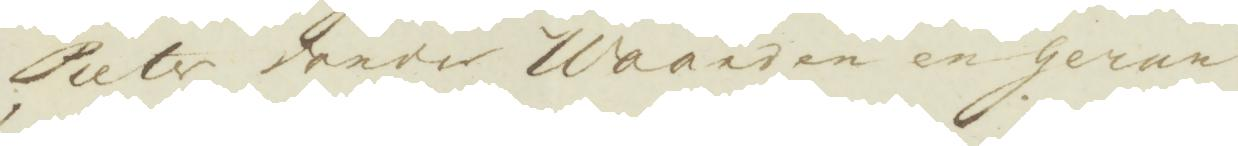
Pieter vander Waarden en Gerar
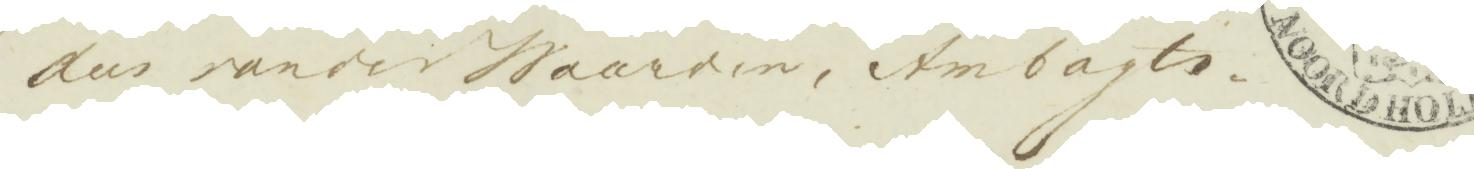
dus vander Waarden, Ambagts„
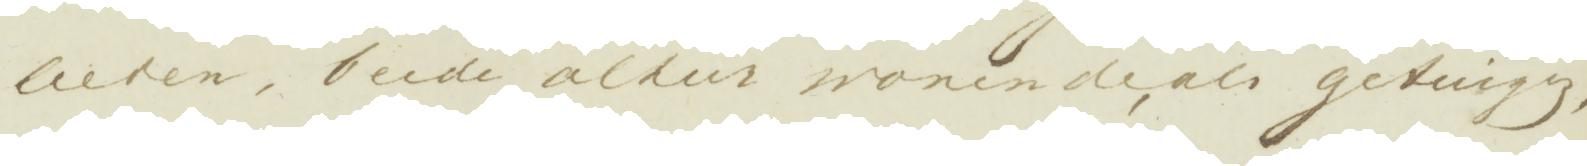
lieden, beide alhier wonende, als getuigen,
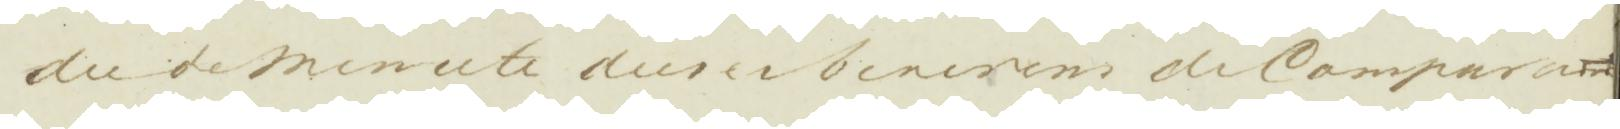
die de minute deeser benevens de Comparant
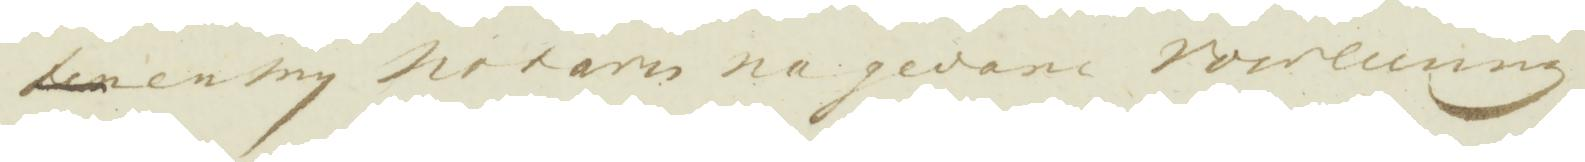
ten en my Notaris na gedane voorleesing
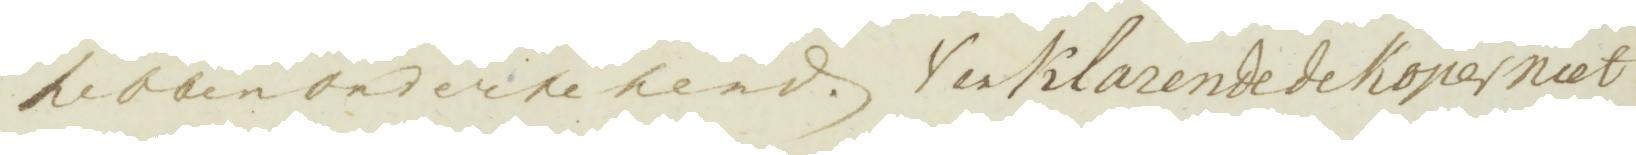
hebben ondertekend. Verklarende de Koper niet
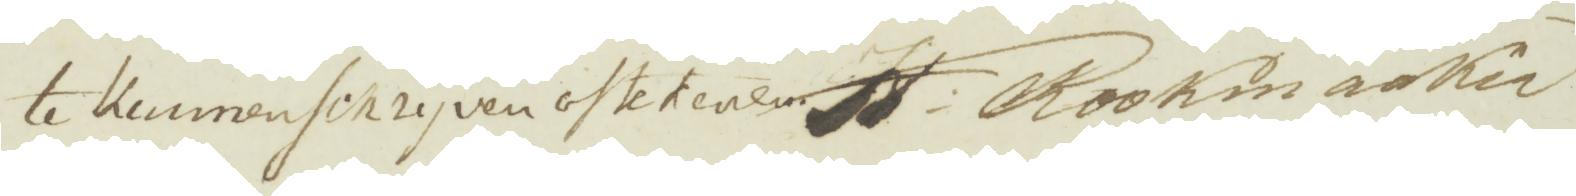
te kunnen schrijven of tekenenen H: Rookmaaker
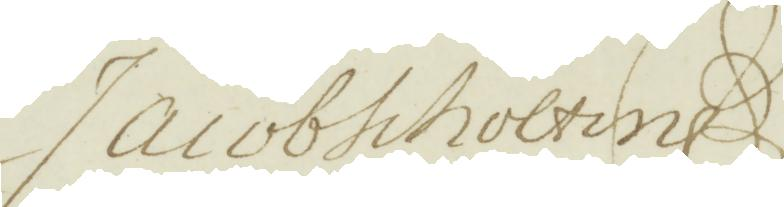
Jacobscholten
